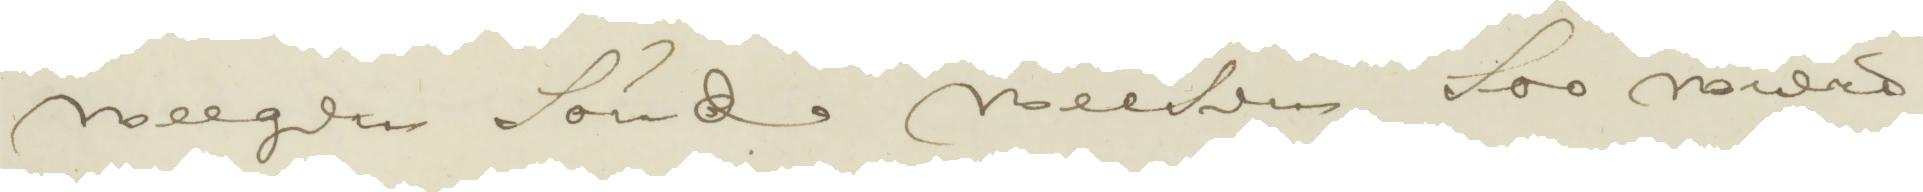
weegen soude weesens, soo wierd
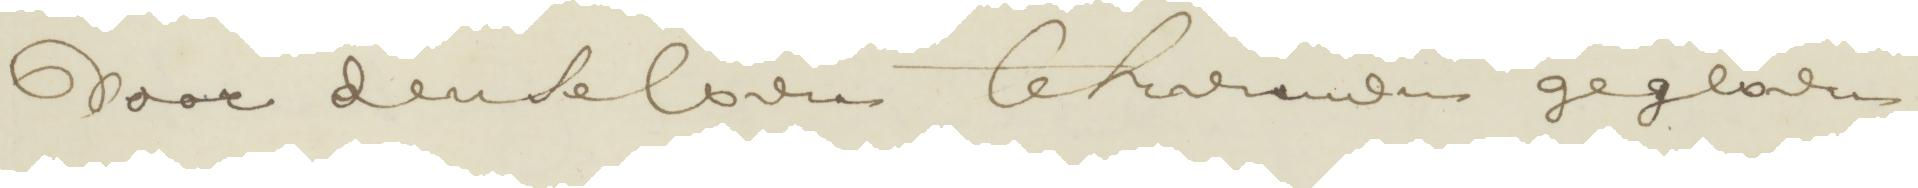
door denselven te kennen gegeven
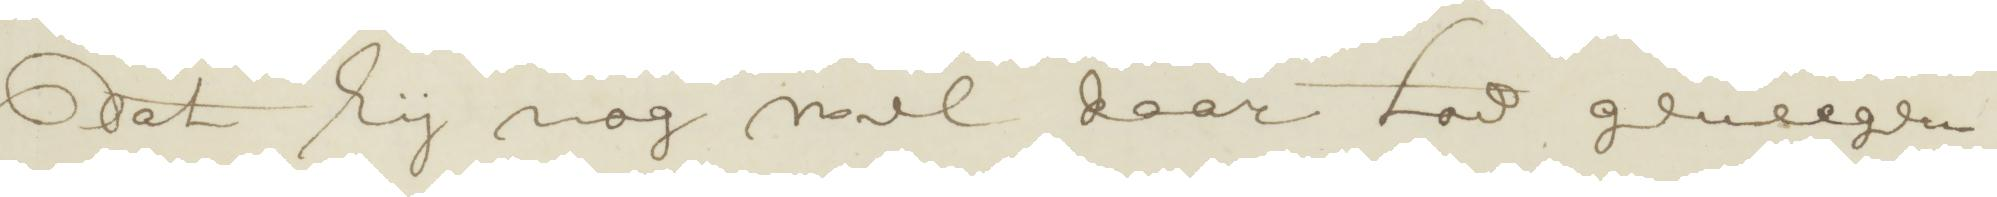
dat hij nog wel daar toe geneegen
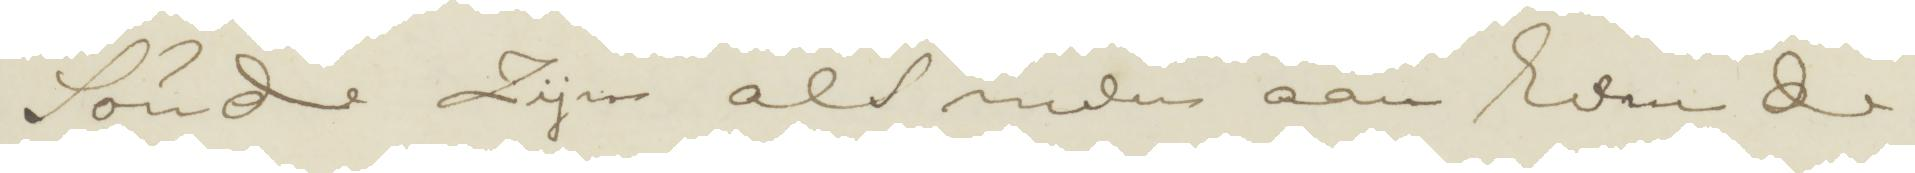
soude zijn als men aan hem de
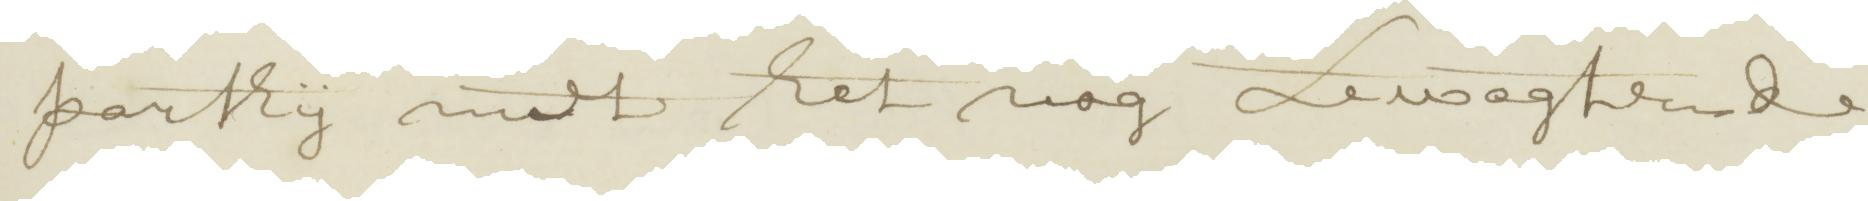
parthij met het nog te wagtende
